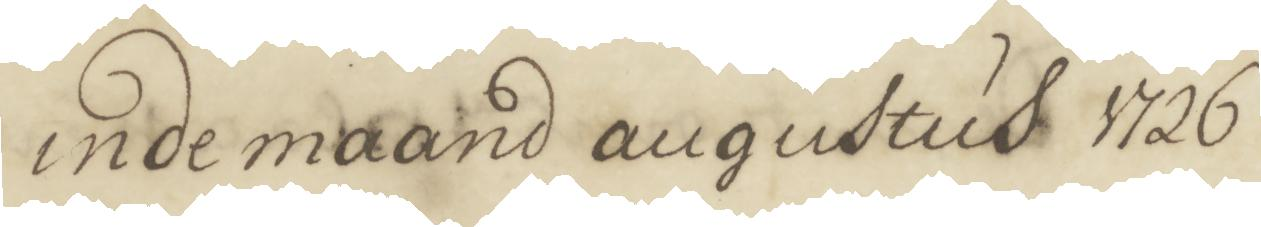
in de maand augustus 1726
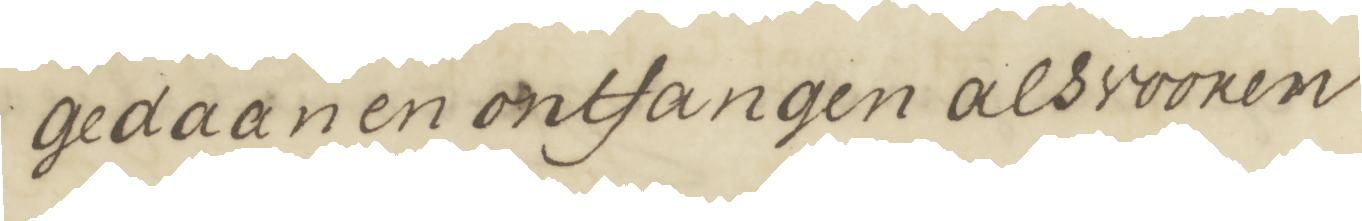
gedaan en ontfangen als vooren
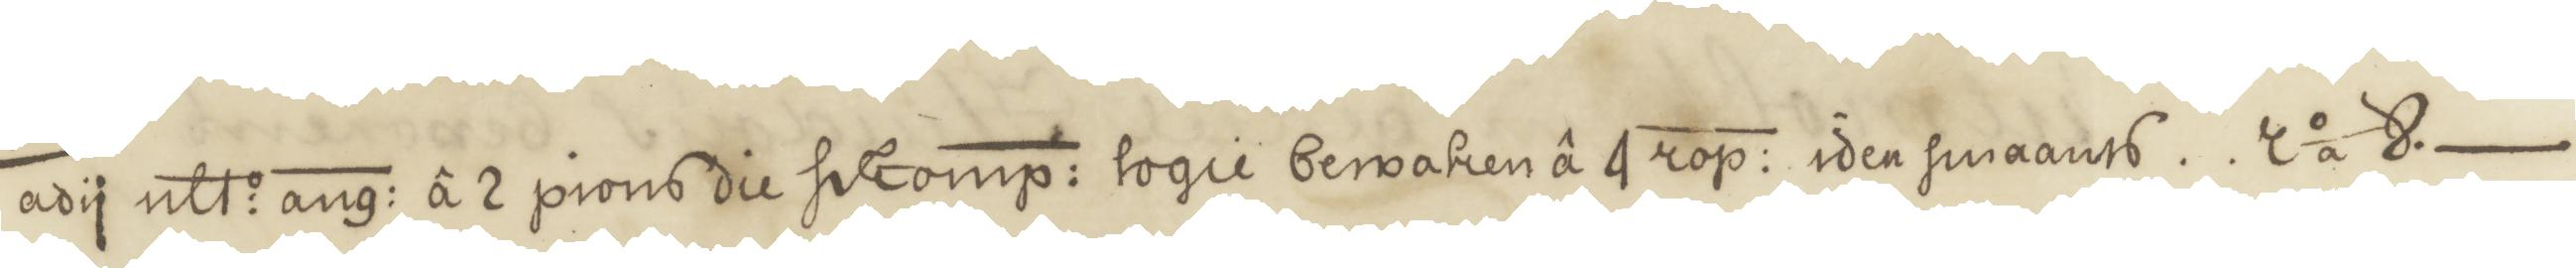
adij ult:o ang: â 2 pions die sEComp: logie bewaken â 4 rop: ider smaants - - r o/a 8. —
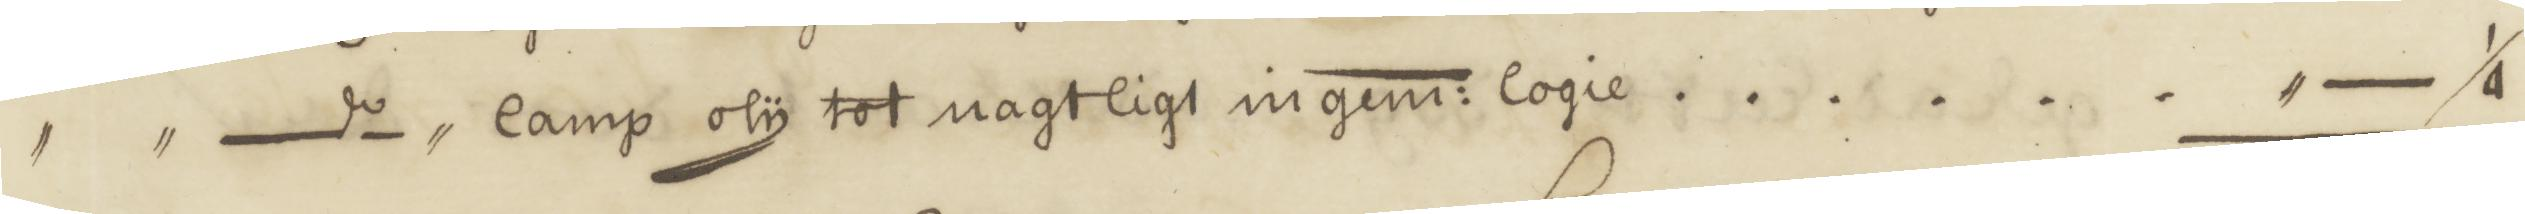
„ „ d-o „ lamp olij tot nagtligt in gem: logie - - - - - - „ — ¼
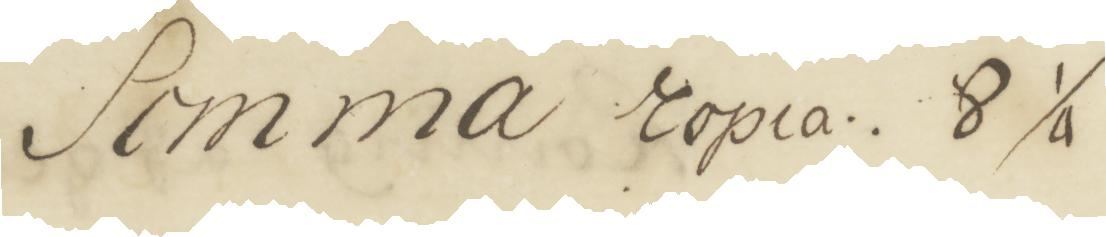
Somma Ropia. 8¼
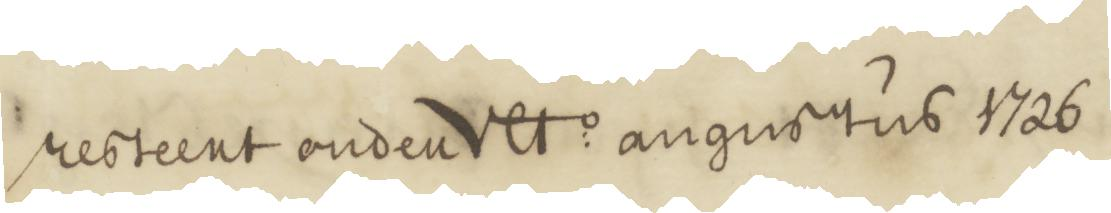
resteert onder Vlt:o augustus 1726
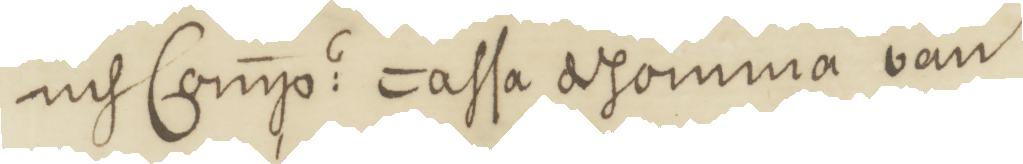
ins Comp:s cassa desomma van
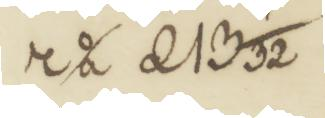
r o/a 213 1/32
